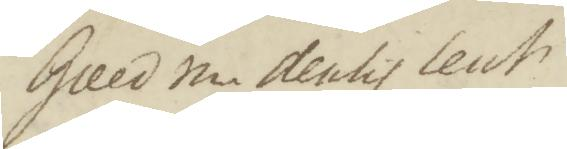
Gield van dertig Cent
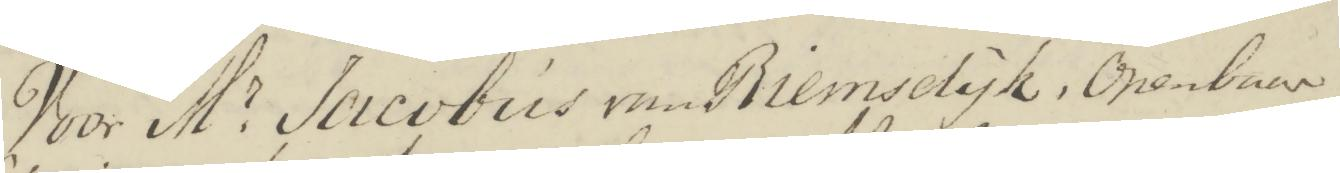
Voor M:r Iacobus van Riemsdijk, Openbaar
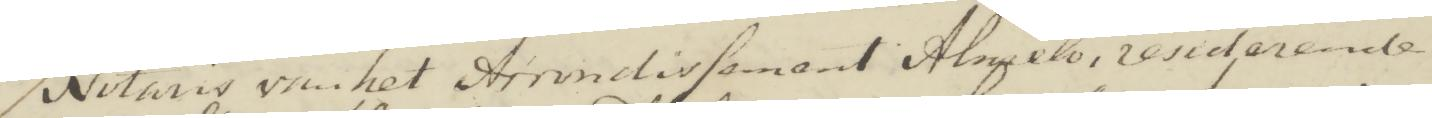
Notaris van het Arrondissement Almelo, residerende
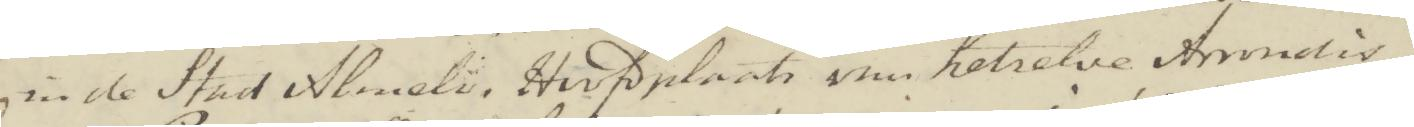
in de Stad Almelo, Hoofdplaats van hetzelve Arrondis
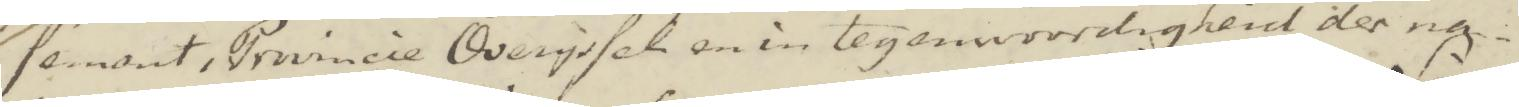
Sement, Provincie Overijssel en in tegenwoordigheid der na=
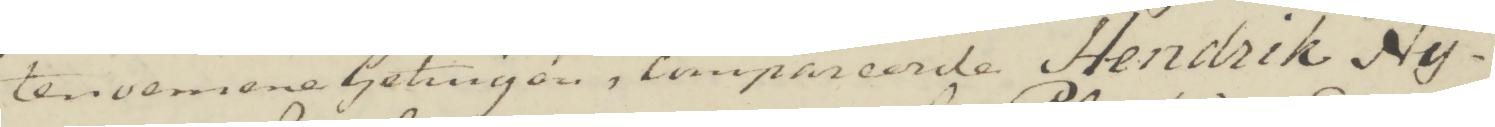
tenoemene Getuigen, compareerde Hendrik Nij
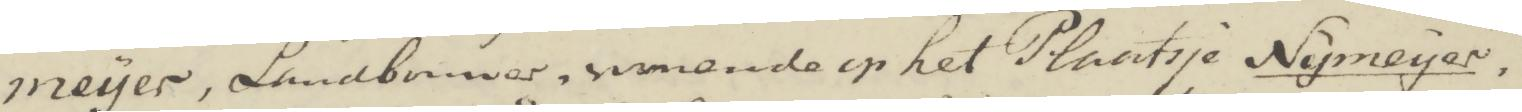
meijer, Landbouwer, wonende op het Plaatsje Nijmeijer,
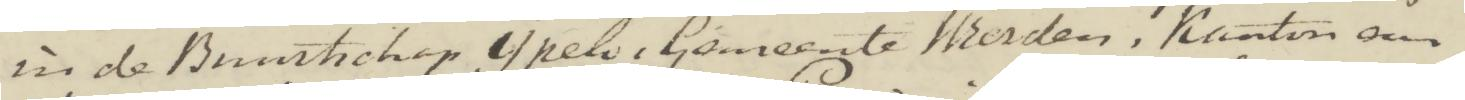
in de Buurtschap IJpelo, Gemeente Wierden, Kanton van
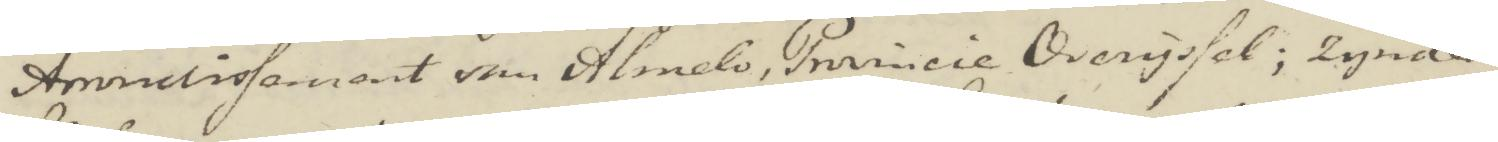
Arrondissement van Almelo, Provincie Overijssel; zijnde
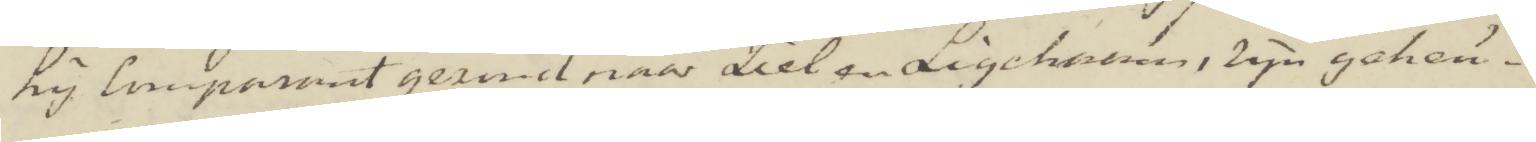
hij Comparant gezond naar Ziel en Ligchaam, zijn geheu=
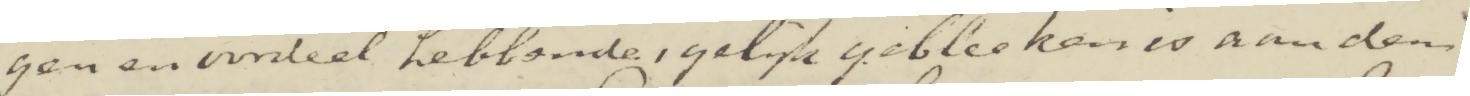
gen en oordeel hebbende, gelijk gebleeken is aan den
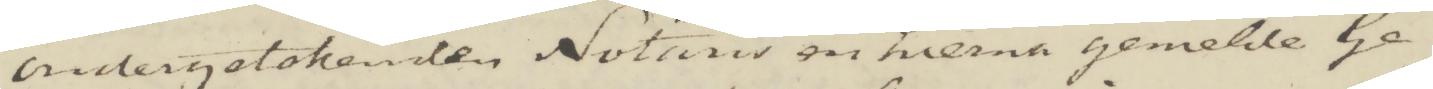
ondergetekenden Notaris in hierna gemelde Ge
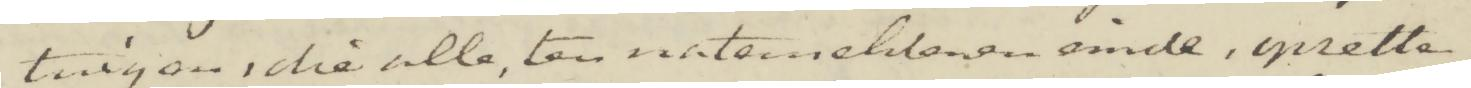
tuigen, die alle, ten natemeldenen einde, opzette
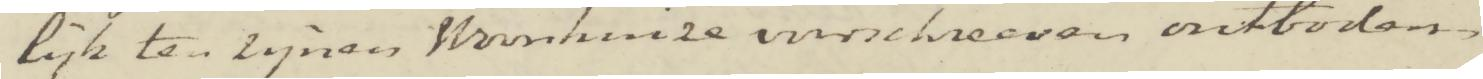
lijk ten zijnen woonhuize voorschreeven ontboden
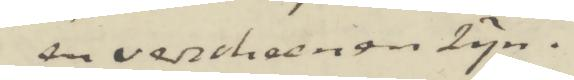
en verscheenen zijn.
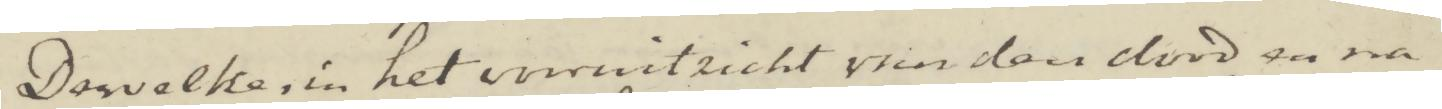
Dewelke, in het vooruitzicht van den dood en na
